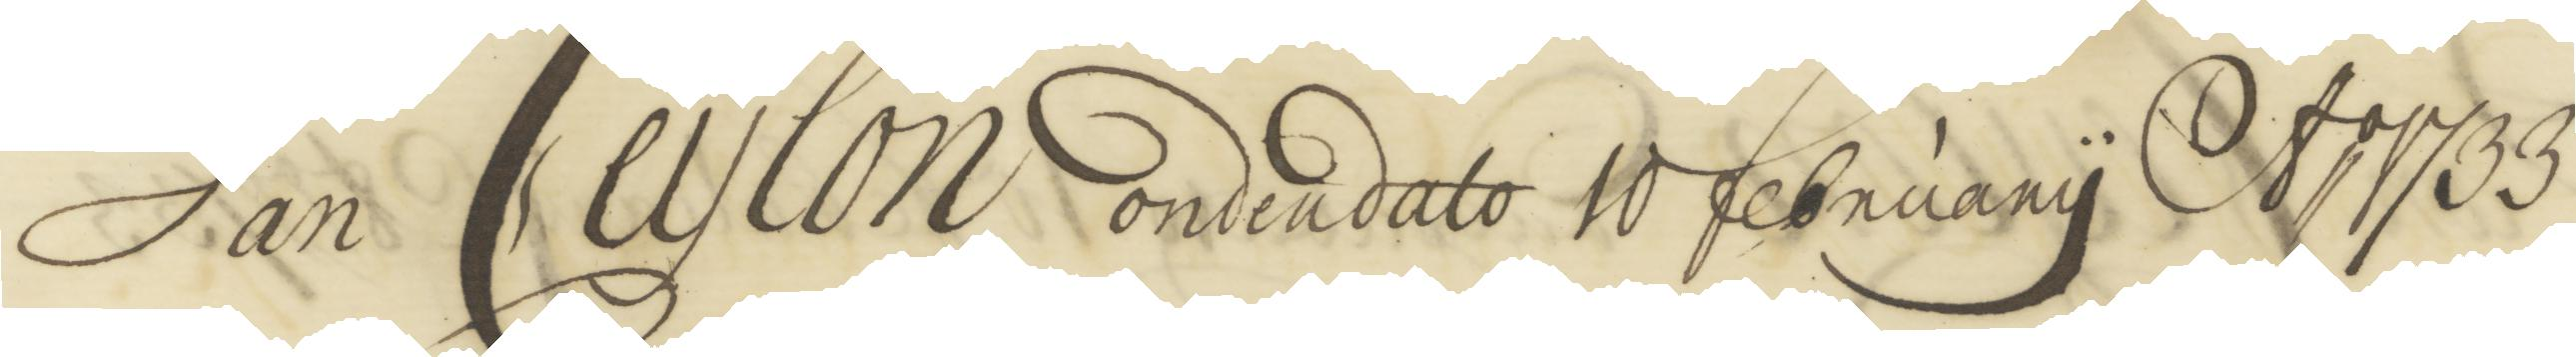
Van Ceijlon onder dato 10 februarij A„o 1733
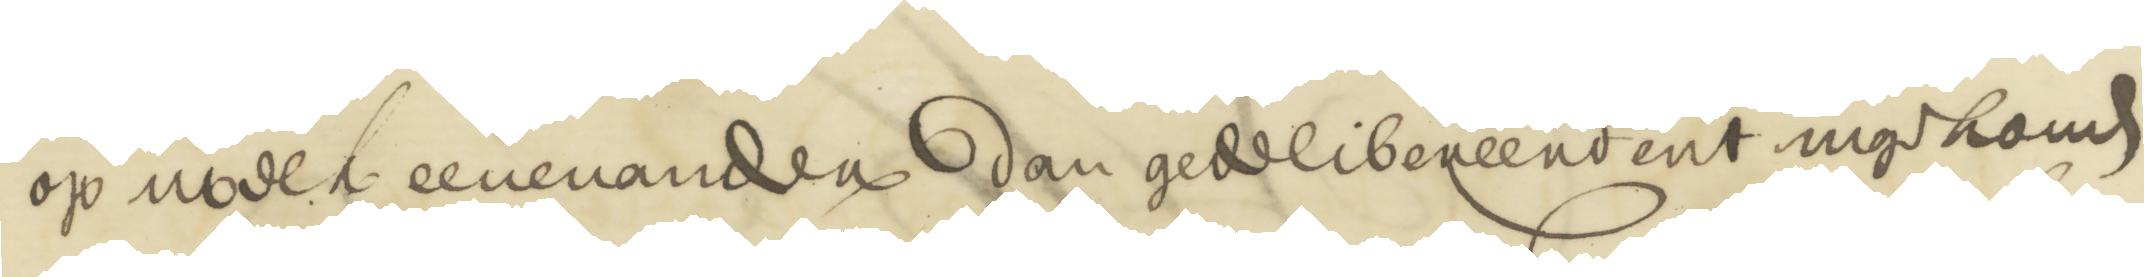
op welk een en ander dan gedelibereerd en 't ingekomen
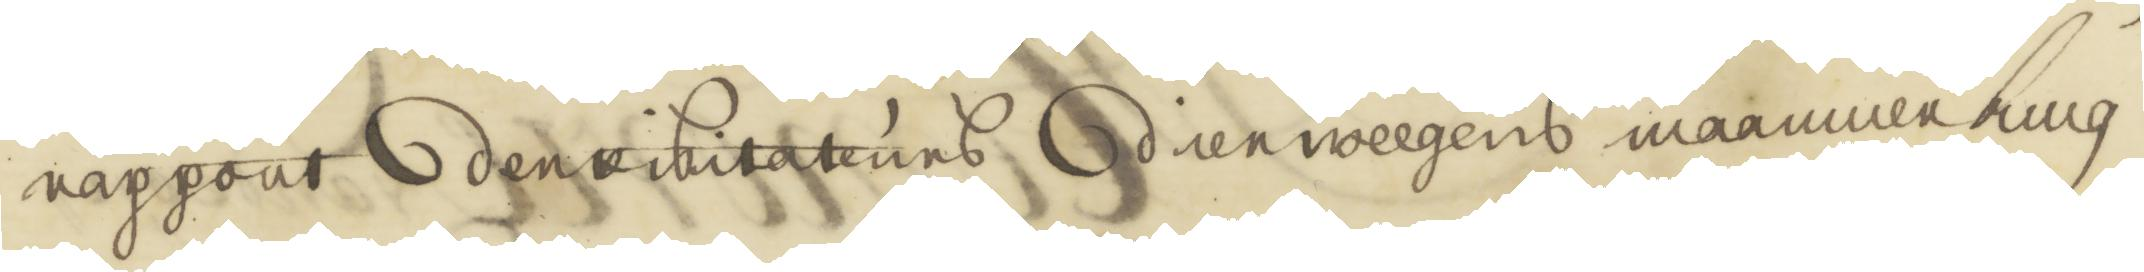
rapport dervisitateurs dierweegens in aanmerking
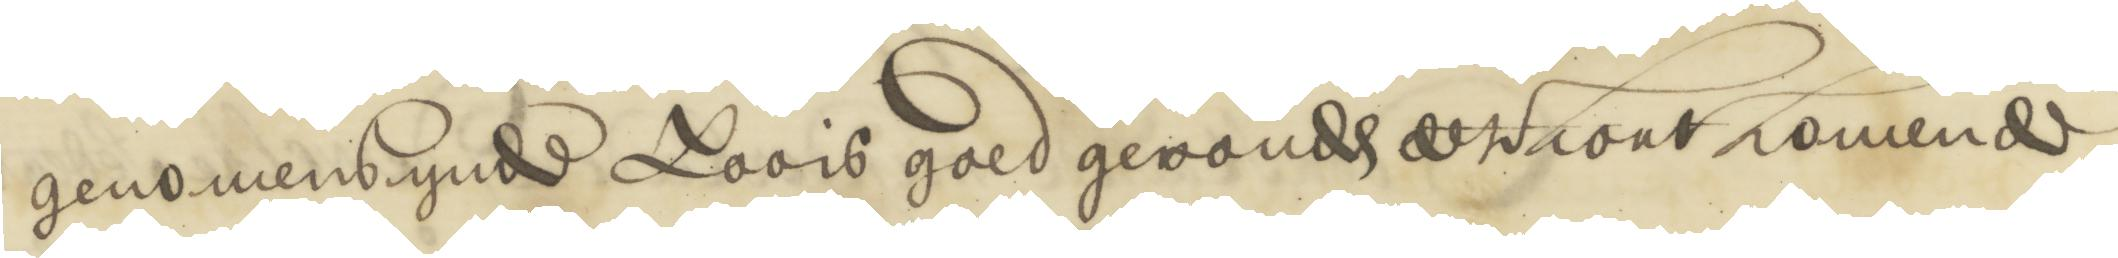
genomen synde Zoo is goed gevonden de tekort komende
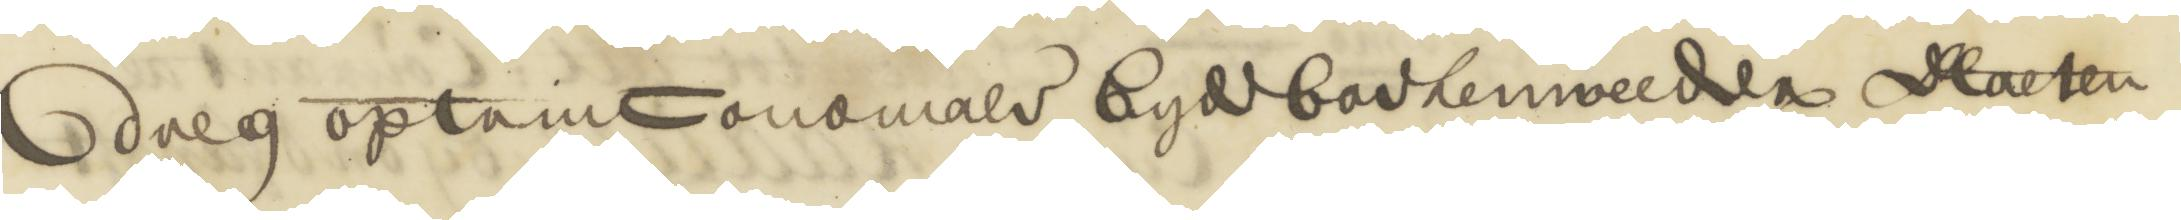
dreg op trinconomale by de boeken weeder telaeten
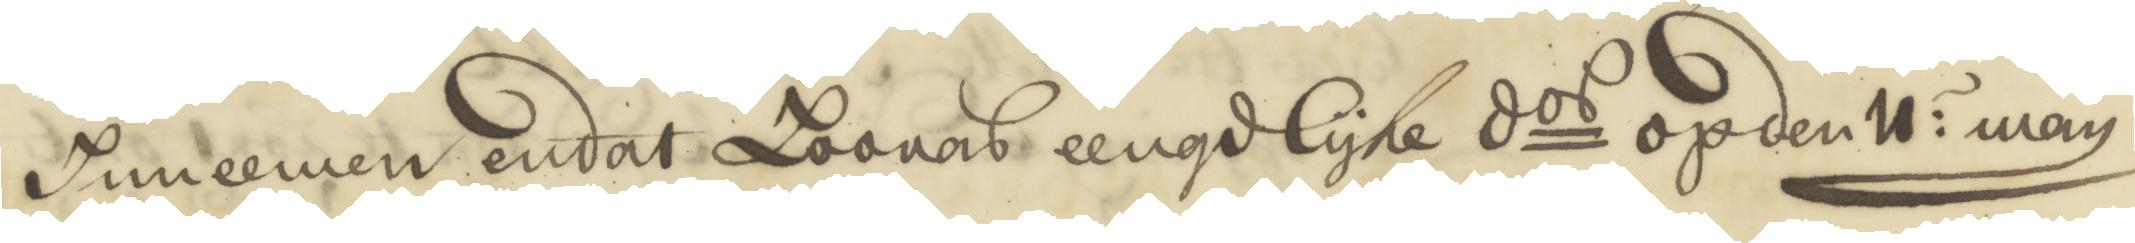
Inneemen endat zoo ras eengelijke d=os op den 11:e may
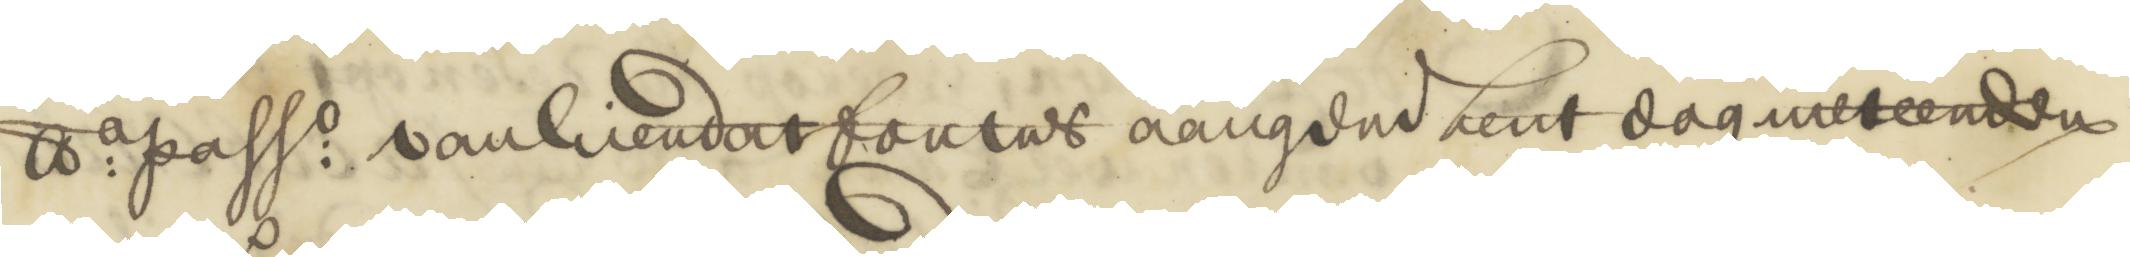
A:a pass:o van hierdat fortres aangerekent dog niet eerder
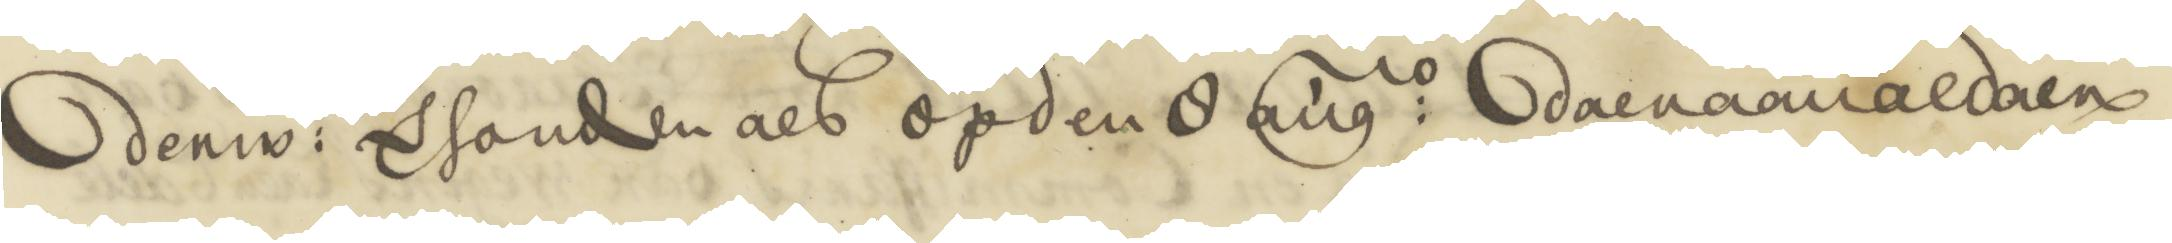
derw:s versonden als op den 8 aug:o daer aan aldaer
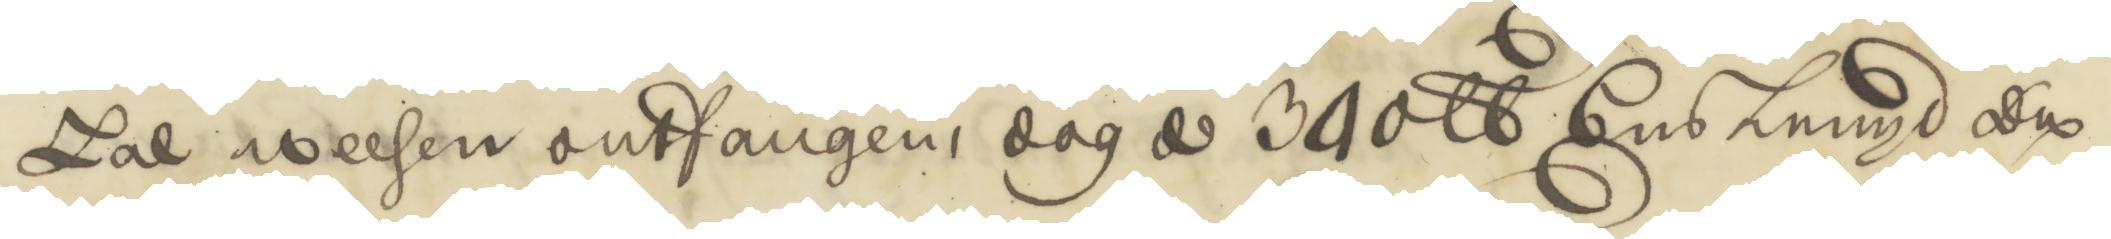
Zal weesen ontfangen, dog de 340 lb buskruyd ter
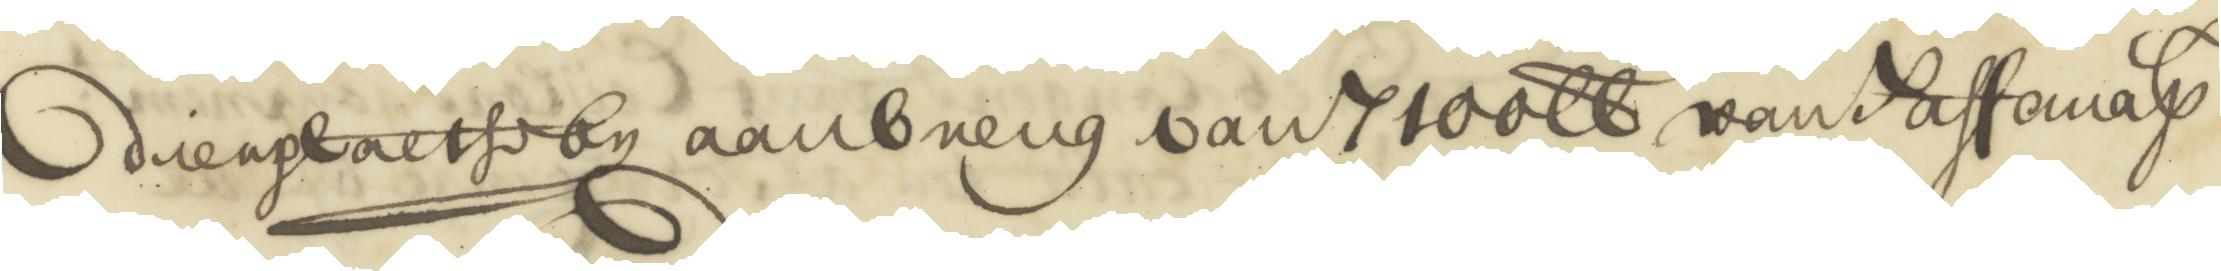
dierplaetse by aanbreng van 7100 lb van Iaffanap
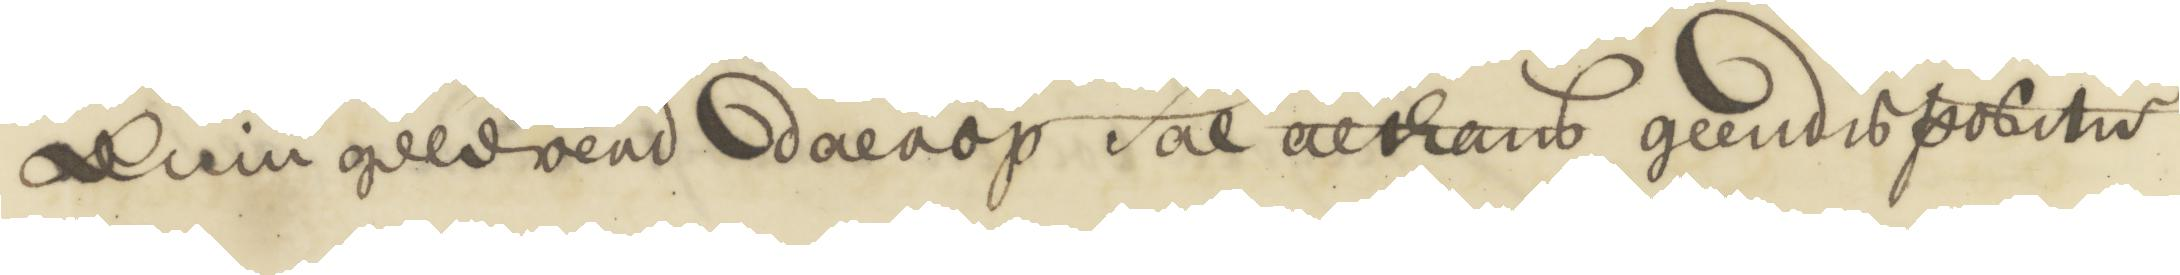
temin geleverd daerop Sal althans geendispositie
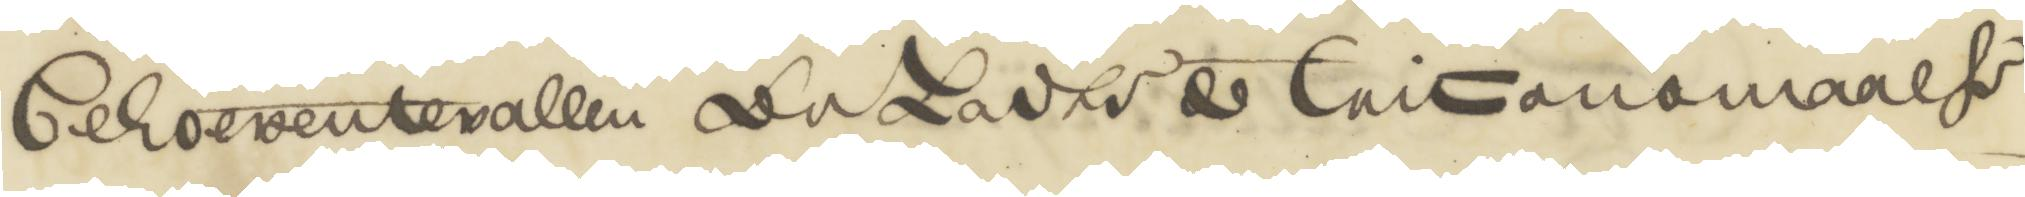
behoeven tevallen ter Zaeke de Triconomaalse
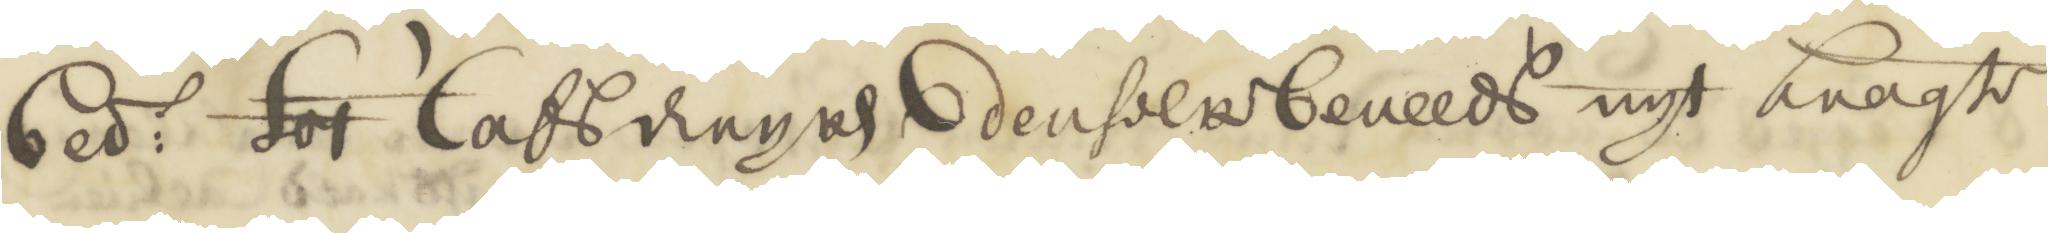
bed:s tot ’t afschryven derselve bereeds uyt kragte
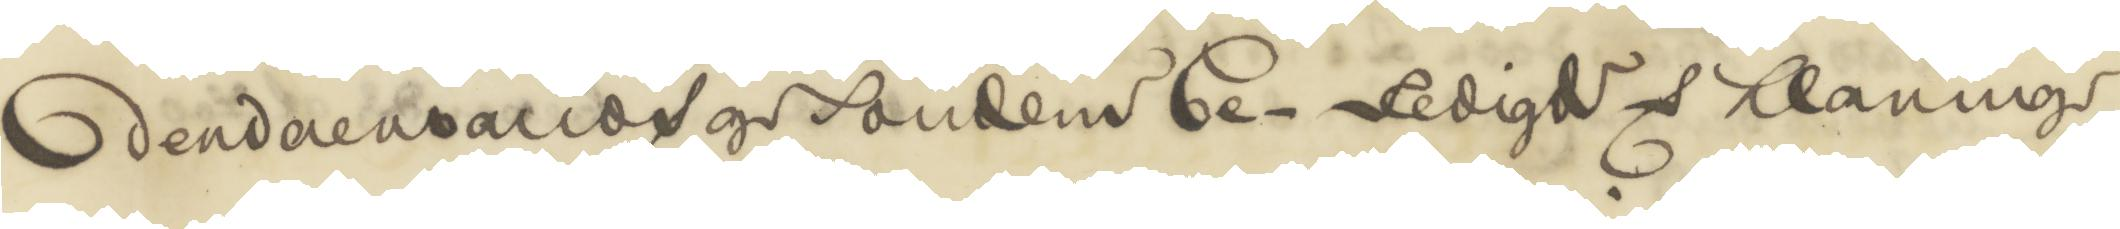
der daer vanover gesondene be- Eedigde verklaringe
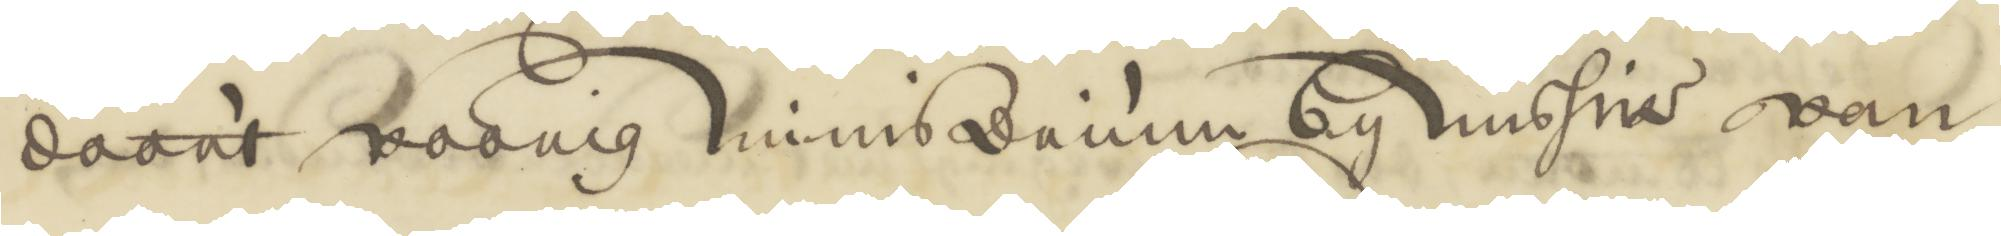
daar't voorig ministerium by missive van
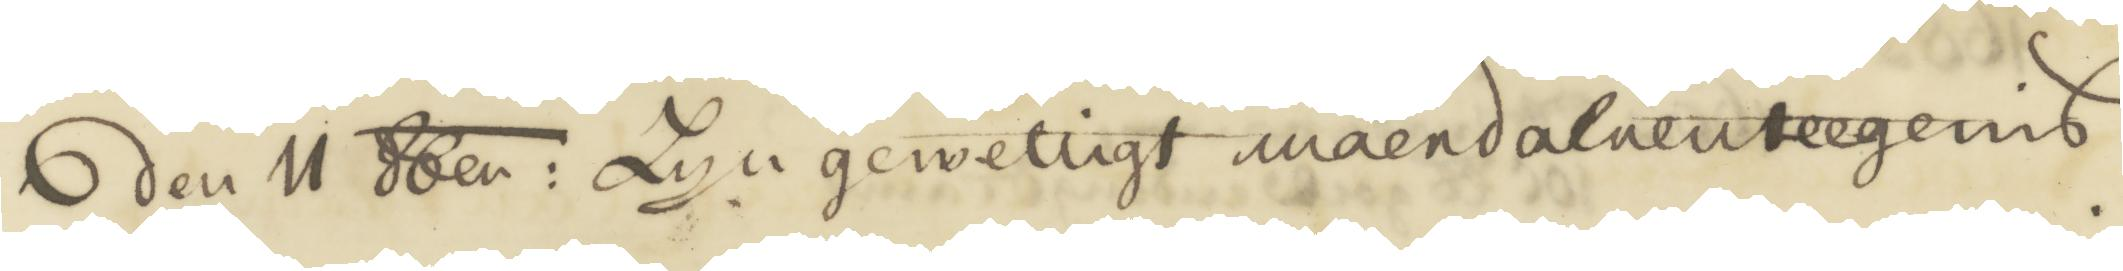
den 11 8ber: Zyn gewettigt maer d alrenteegen is
